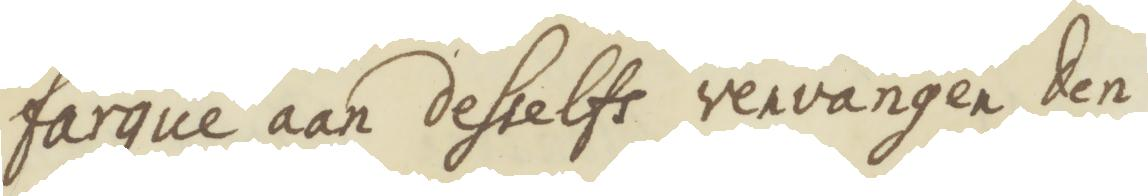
fargue aan desselfs vervanger den
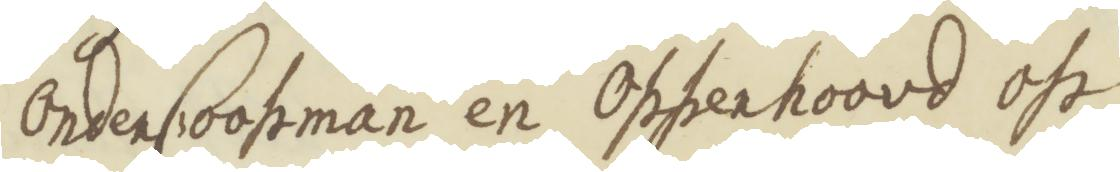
onderCoopman en opperhoovd op
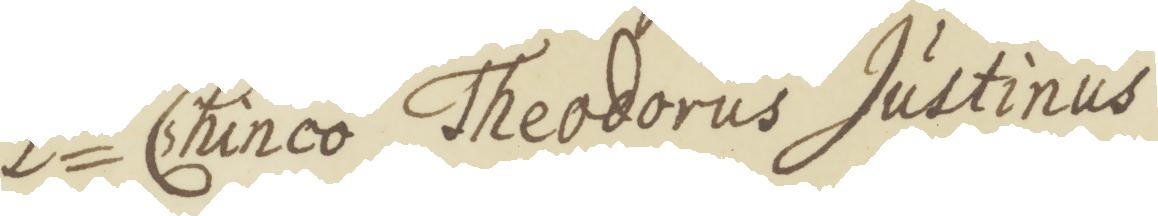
P=lo Chinco Theodorus Justinus
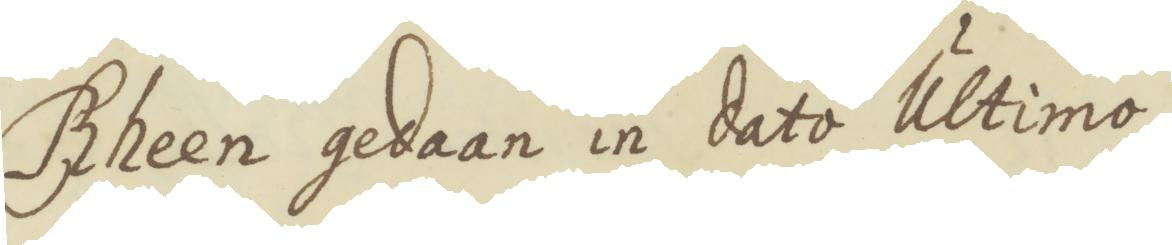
Rheen gedaan in dato ultimo
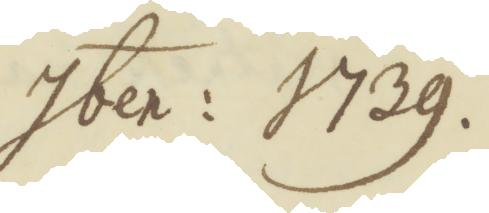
7ber: 1739.
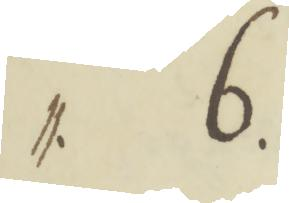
„. 6.
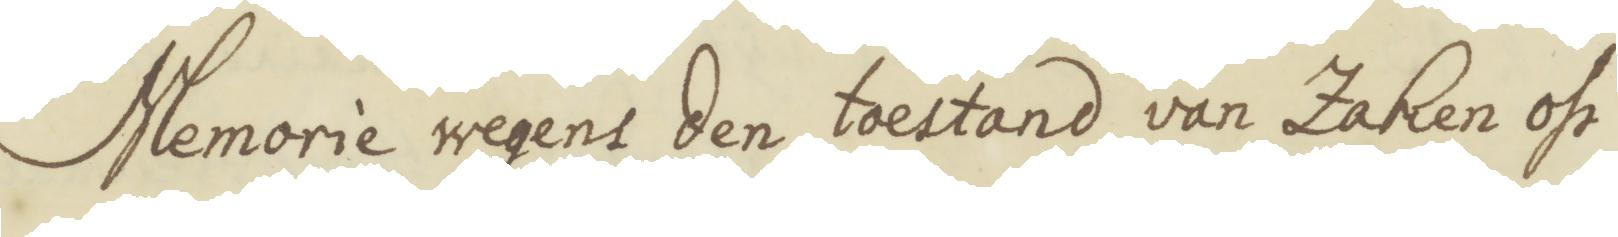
Memorie wegens den toestand van zaken op
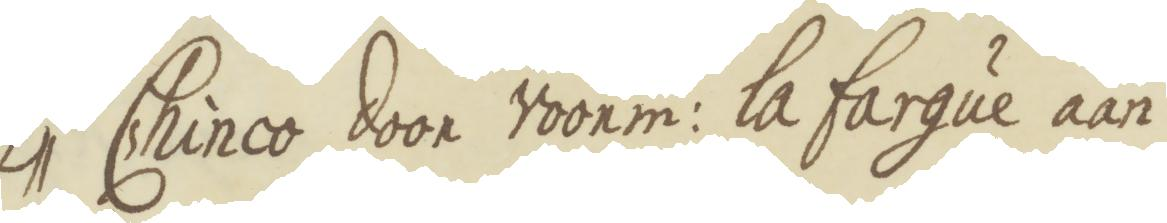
P„lo Chinco door voorm: la fargue aan
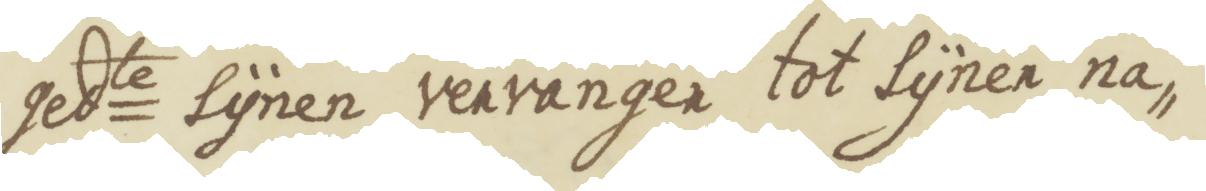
ged=te sijnen vervanger tot sijner na„
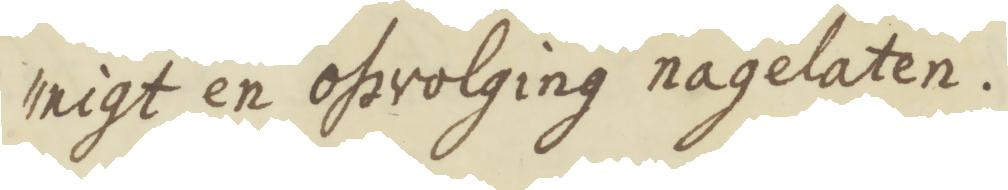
„rigt en opvolging nagelaten.
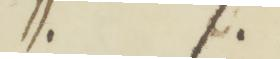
„. 7.
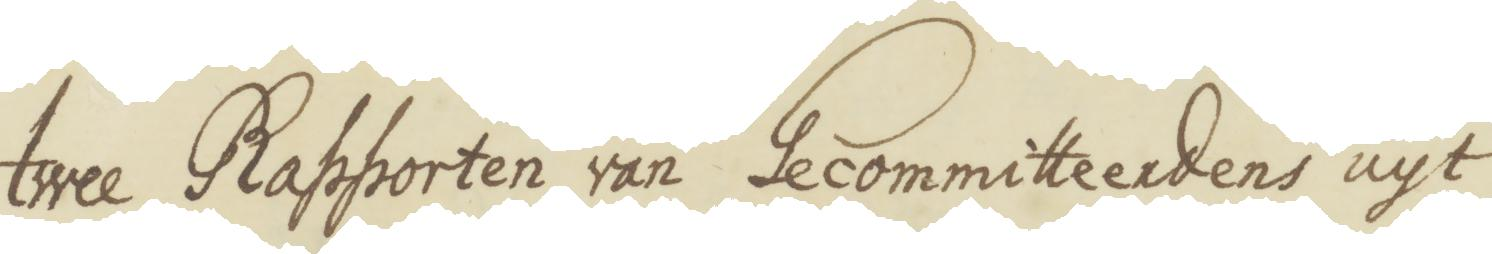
twee Rapporten van Gecommitteerdens uijt
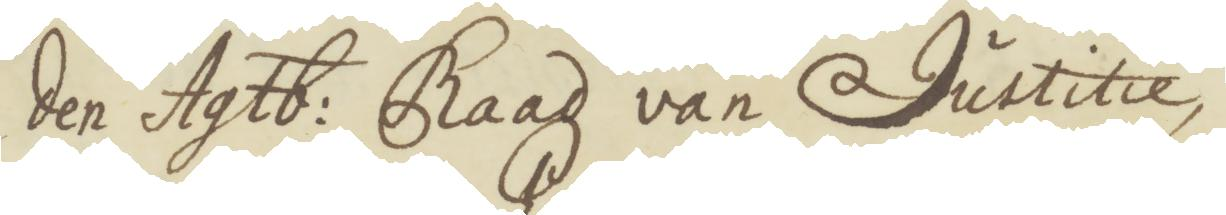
den Agtb: Raad van Iustitie,
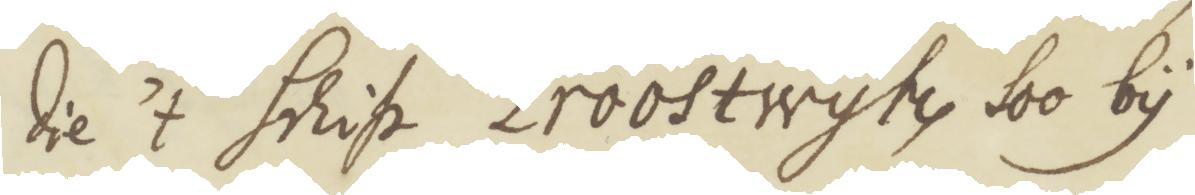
die ’t schip Proostwijk soo bij
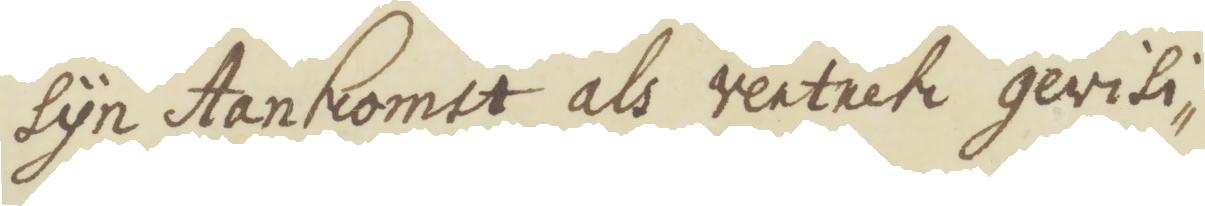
sijn Aankomst als vertrek gevisi„
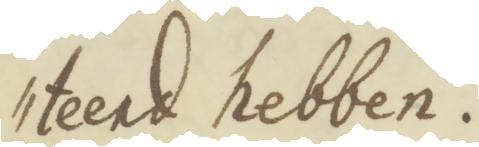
„teerd hebben.
